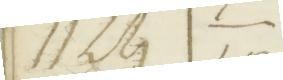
1124 7/15
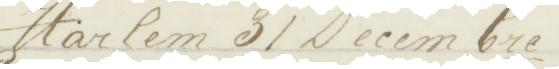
Harlem 31 Decembre
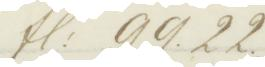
fl: 99.22.
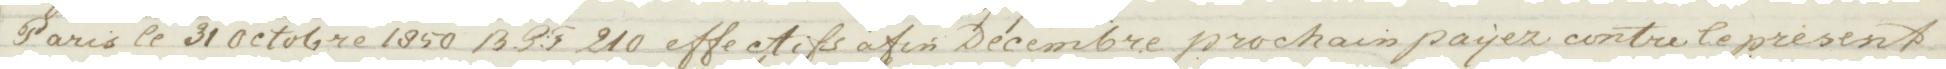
Paris le 31 octobre 1850 B.P:F 210 effectifs afin Decembre prochain paijez contre le present
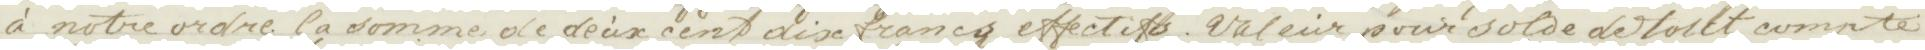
à notre ordre la somme de deux cent dix francs effectifs. Valeur pour solde de tout compte
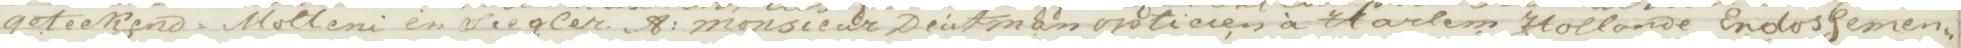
geteekend = Molteni en Siegler. &: monsieur Deutman opticien à Harlem Hollande Endossemen„
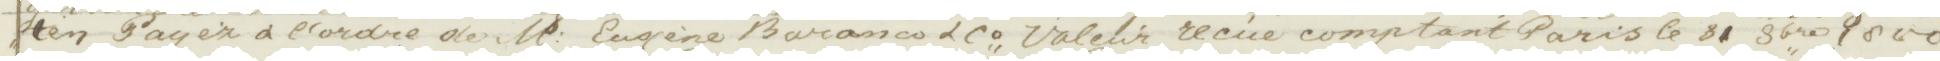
ten Payez a l'ordre den M: Eugene Baranco d C=o. Valeur recue comptant Paris le 31 8„bre 1800
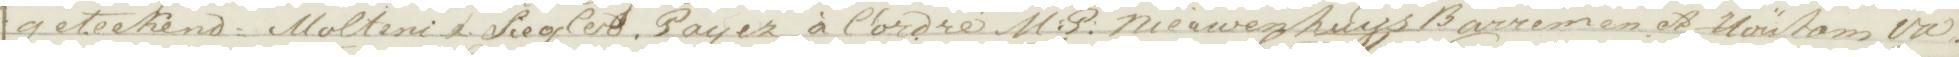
geteekend Molteni & Siegler. Payez à l'ordre M:P: Nieuwenhuys Barremen A Houtam va
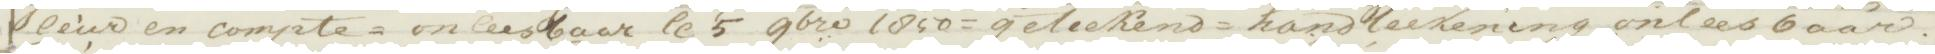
leur en compte = onleesbaar le 5 9„bre 1850 = geteekend = handteekening onleesbaar
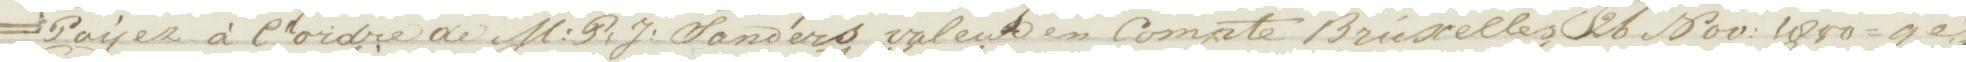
= Paijez à l'ordre de M: P: J: Sanders valeur en Compte Bruxelles 26 Nov: 1850 = ge,
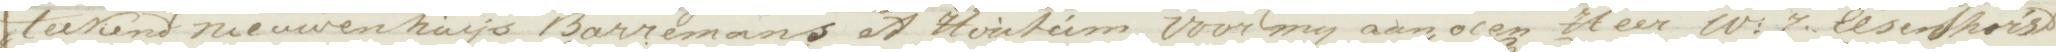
teekend Nieuwenhuijs Barremans A Houtum voor my aan den Heer W: J: Elsenhorst
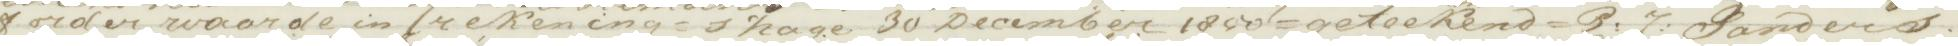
of order waarde in rekening = s Hage 30 December 1850 = geteekend P:J: Panders
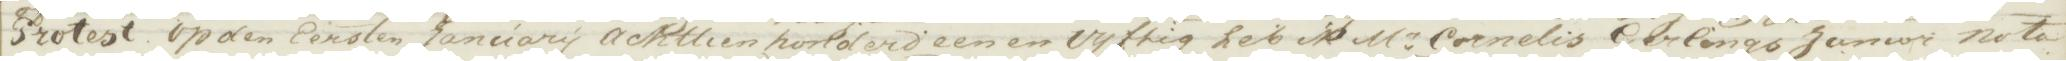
Protest. op den Eersten Januarij achttien honderd een en vyftig heb ik M„r Cornelis Gerlings Junior nota
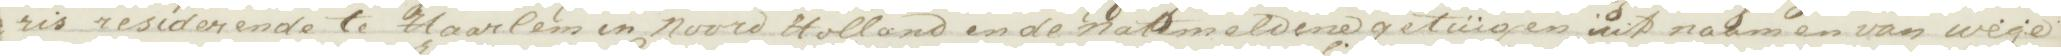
ris residerende te Haarlem in Noord Holland en de natemeldene getuigen uit naamen van wege
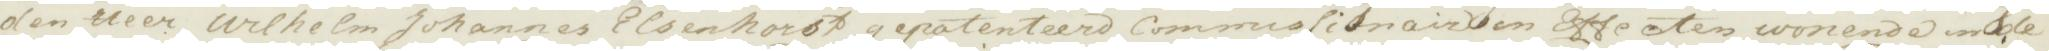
den Heer Wilhelm Johannes Elsenhorst gepatenteerd Commissionair en Effecten wonende in de
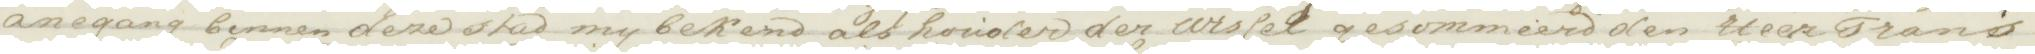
anegang binnen deze stad my bekend als houder der wissel gesommeerd den Heer Frans
